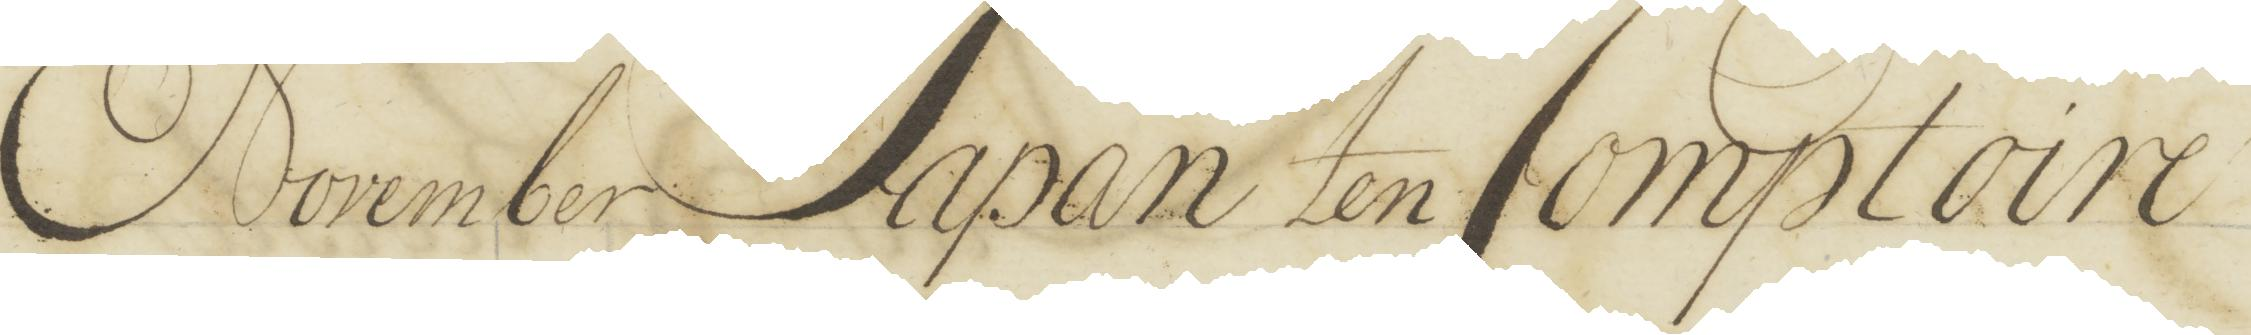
November Iapan ten Comptoire
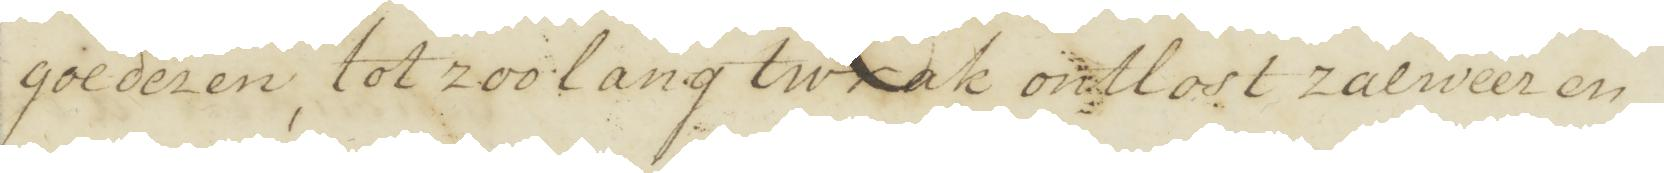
goederen, tot zoo lang twrak ontlost zalweezen,
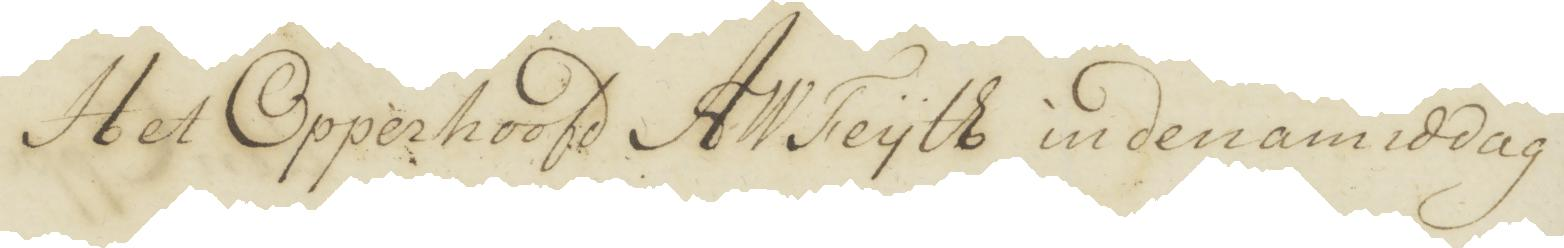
Het Opperhoofd AW Feijth in denamiddag
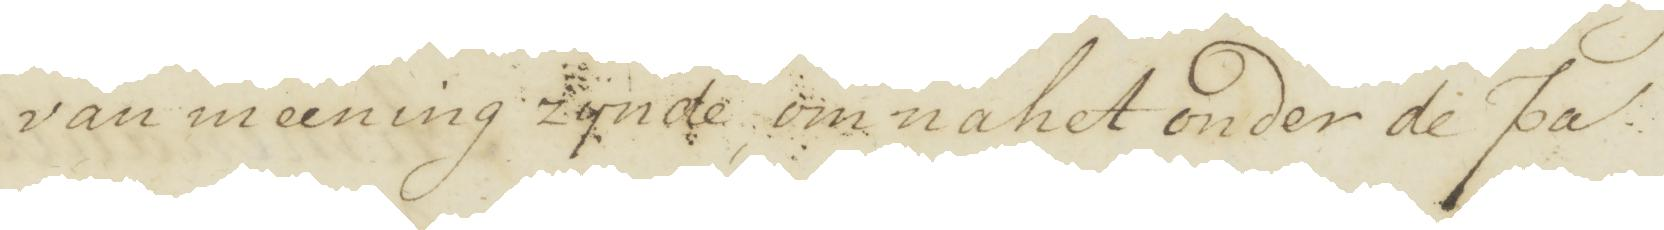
van meening zijnde om na het onder de pa
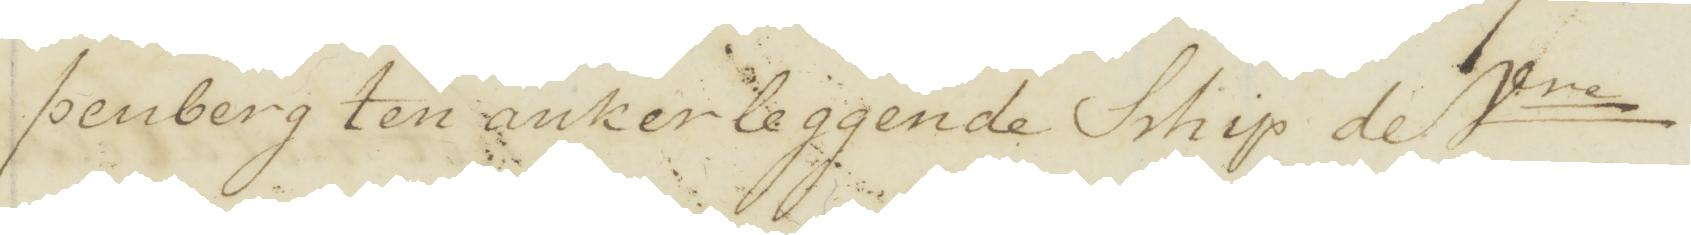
penberg ten anker leggende schip de V=ne
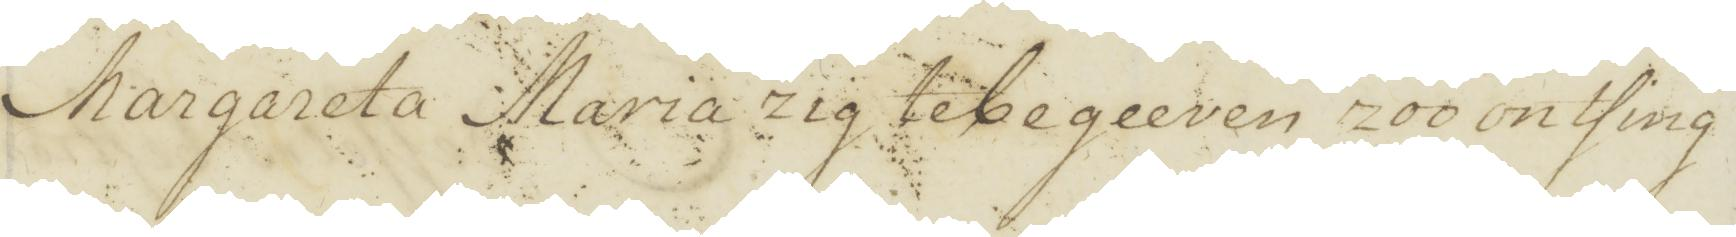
Margareta Maria zig te begeeven, zoo ontfing
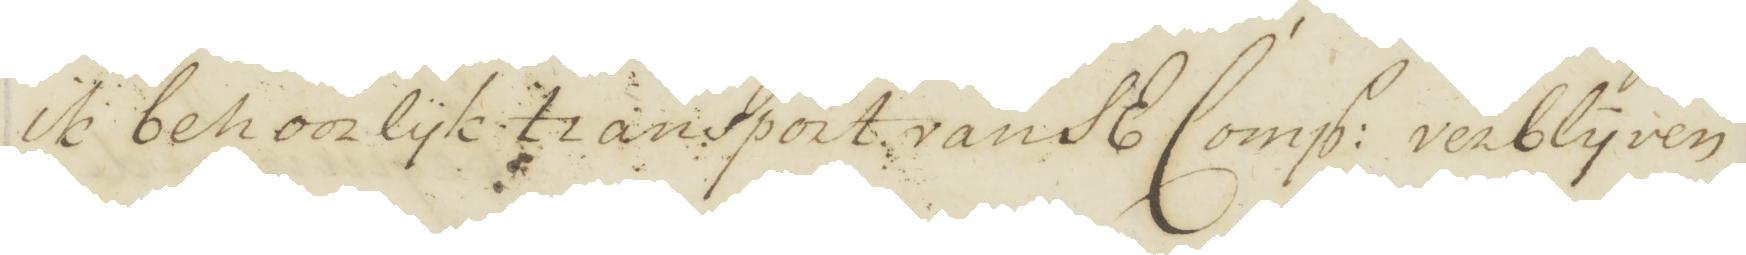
ik behoorlijk transport van sE Comp:s verblijven
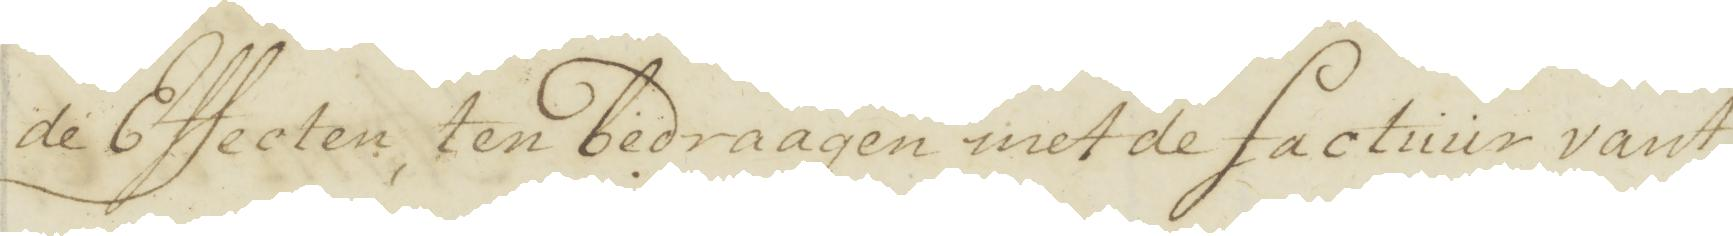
de Effecten, ten bedraagen met de factuur vant
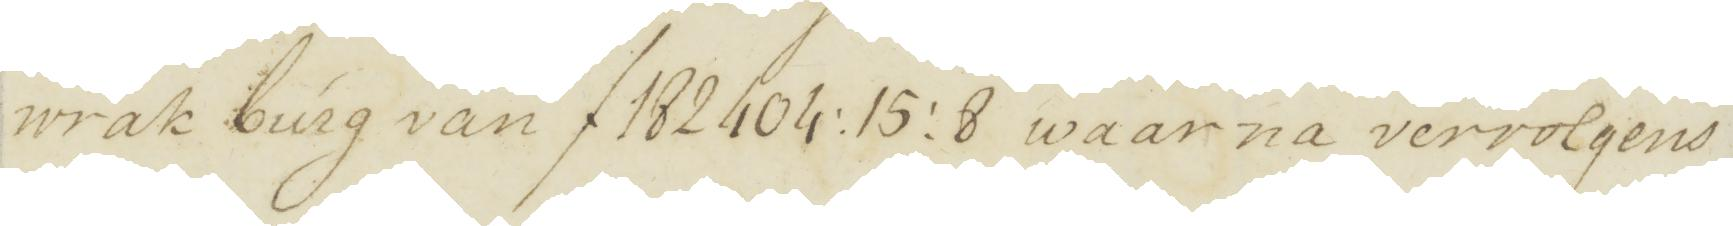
wrak burg van ƒ182404:15:8 waar na vervolgens
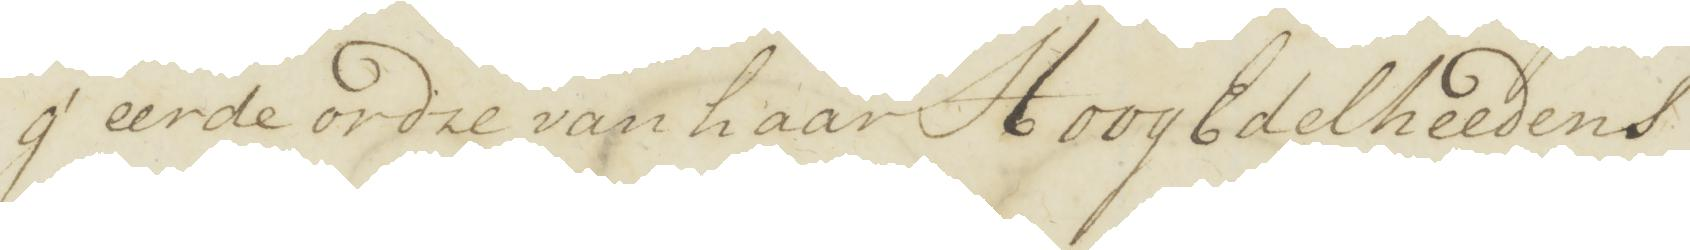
g’ eerde ordre van haar Hoog Edelheedens
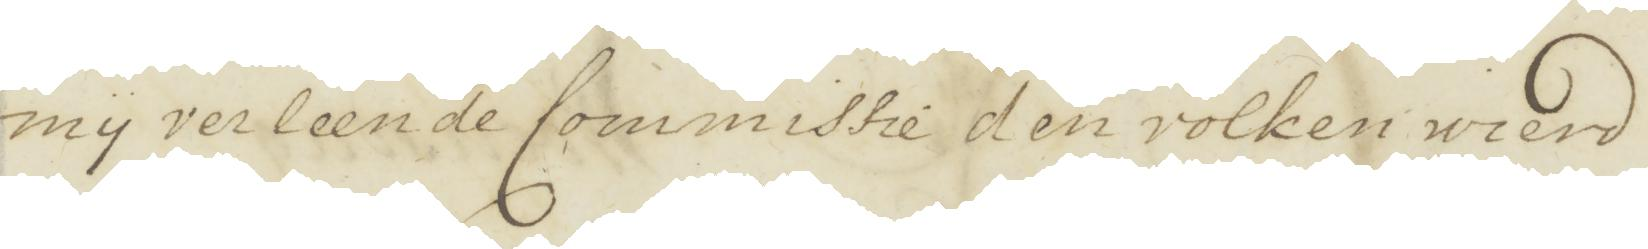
mij verleende Commissie den volken wierd
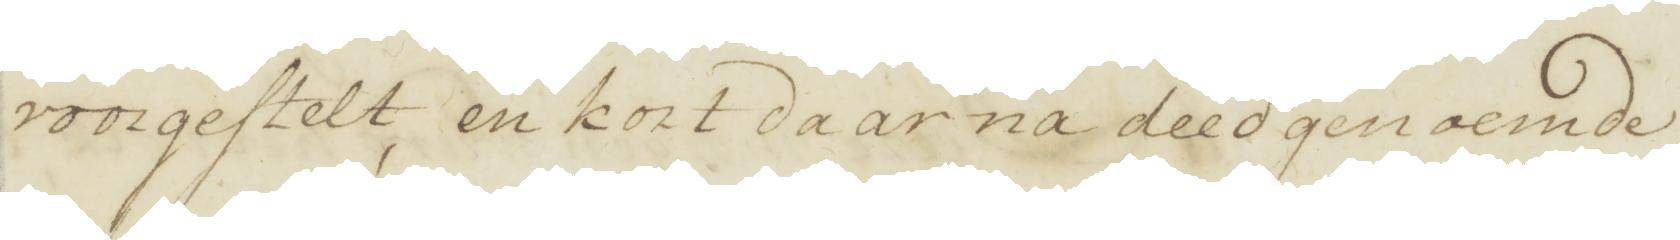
voorgestelt, en kort daar na deed genoemde
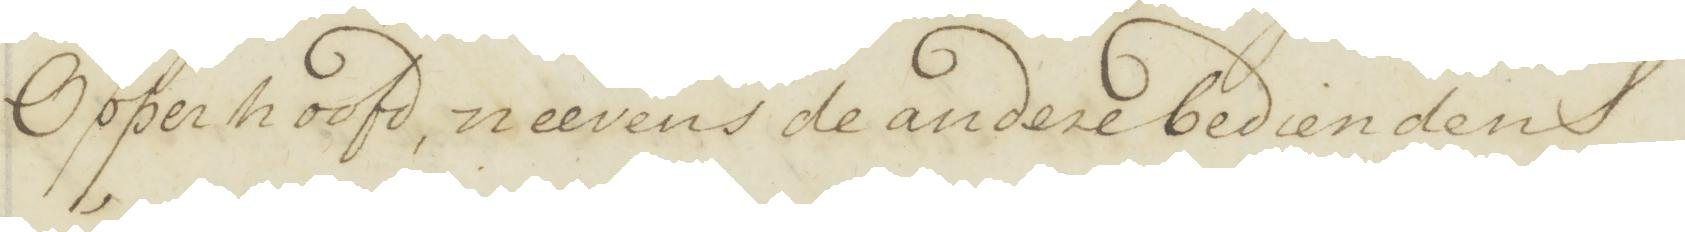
Opperhoofd, neevens de andere bediendens
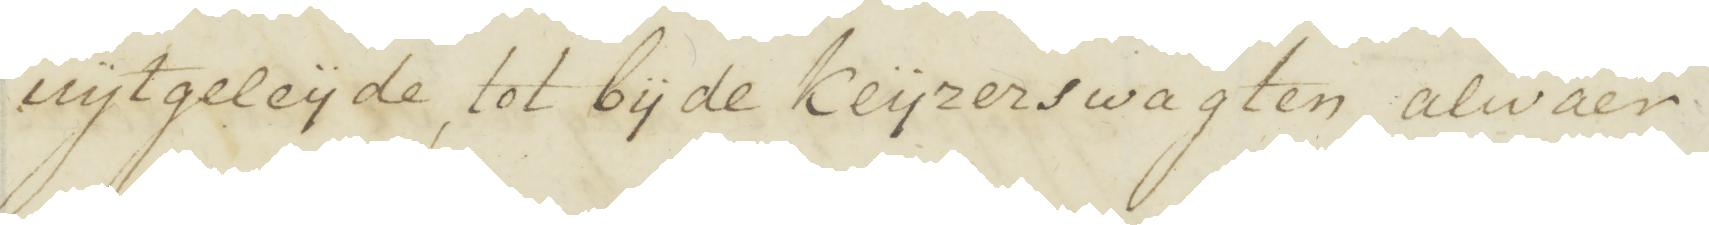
uijtgeleijde, tot bij de keijzerswagten, alwaer
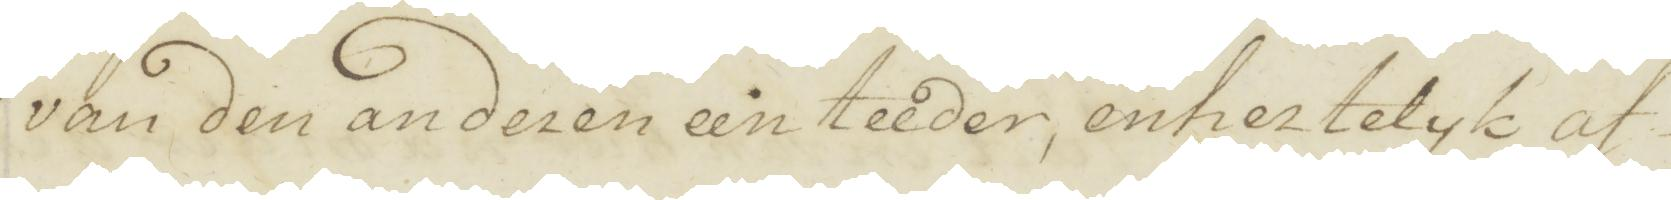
van den anderen een teeder, en hertelyk af
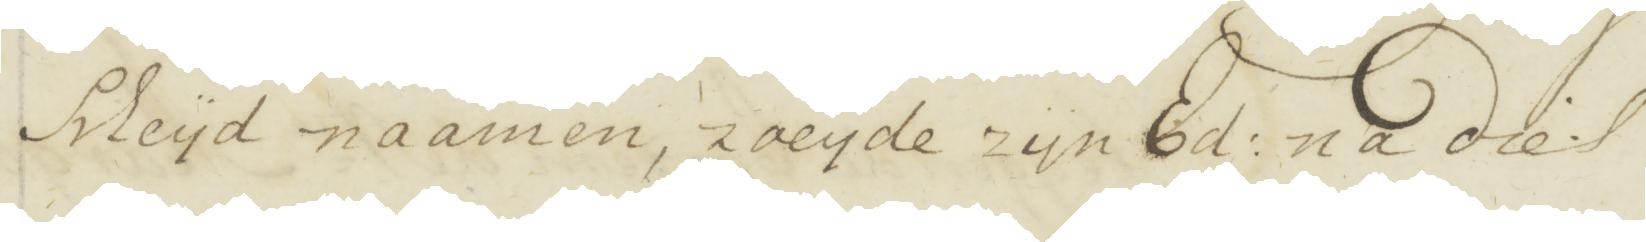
scheijd naamen, zolijde zijn Ed: na dies
